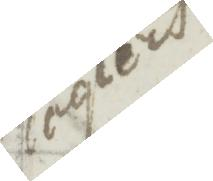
dogters
